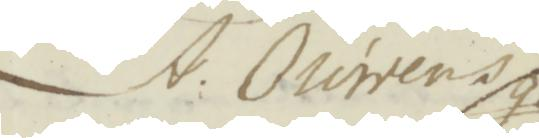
A. Ouwens
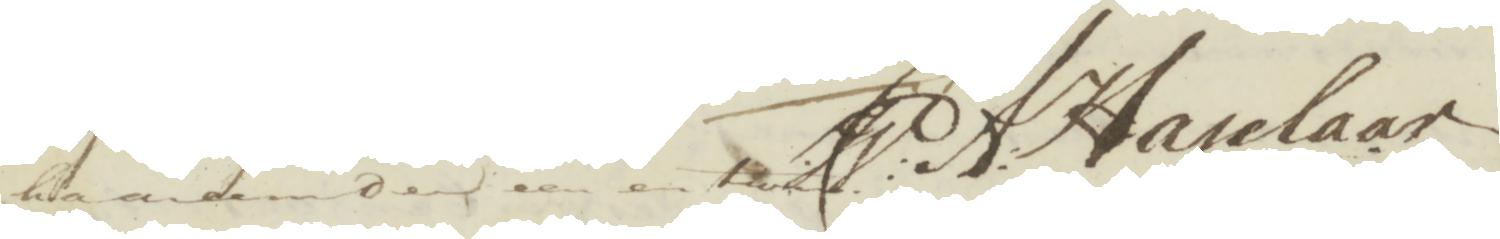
haarlem den een en tacht W:A: Haselaar
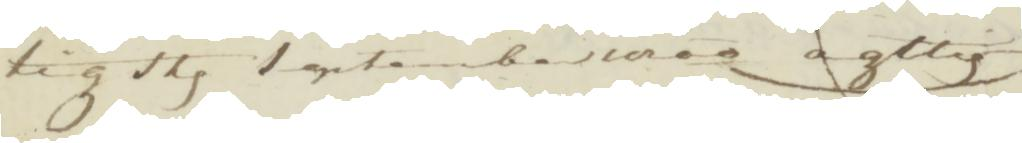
tigsten September 1800 agtig
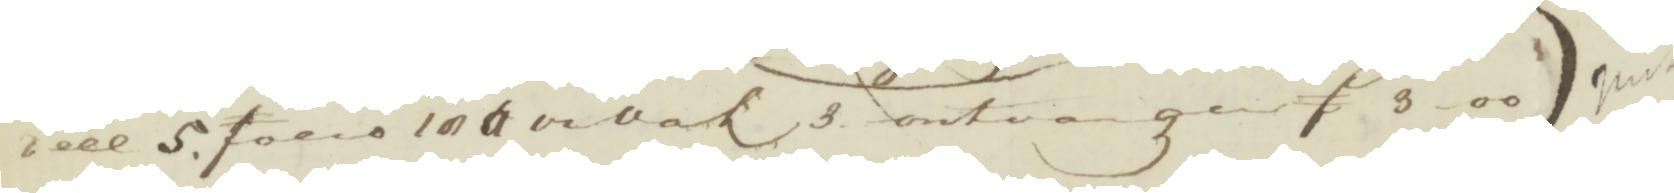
roll 5. folio 186 vak 3. ontangen ƒ3 00
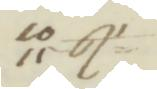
10/11 oC
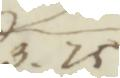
3. 75
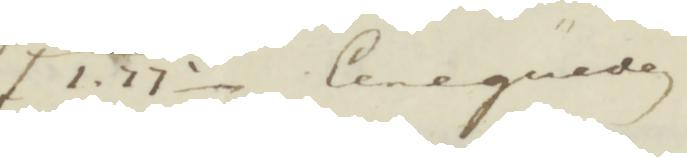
ƒ 1. 77 — Eene gulden
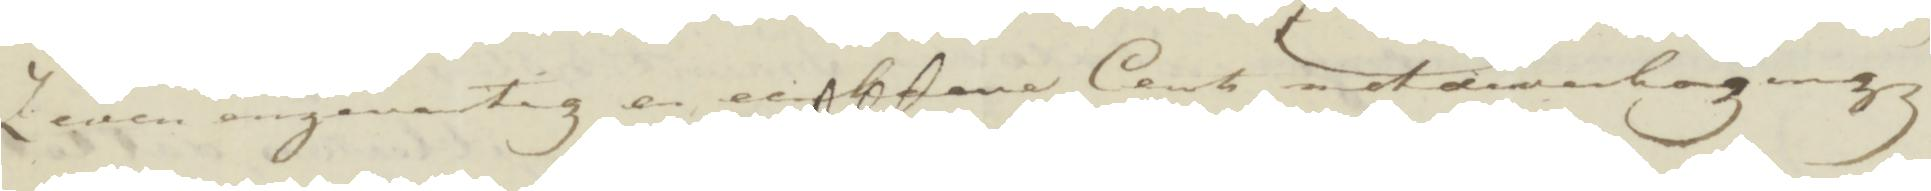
Zeven enzeventig en een halve Cents met de verhogingen
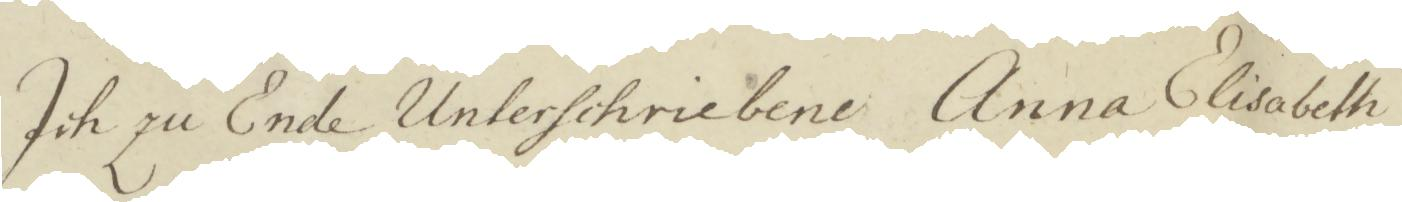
Ich zu Ende Unterschriebene Anna Elisabeth
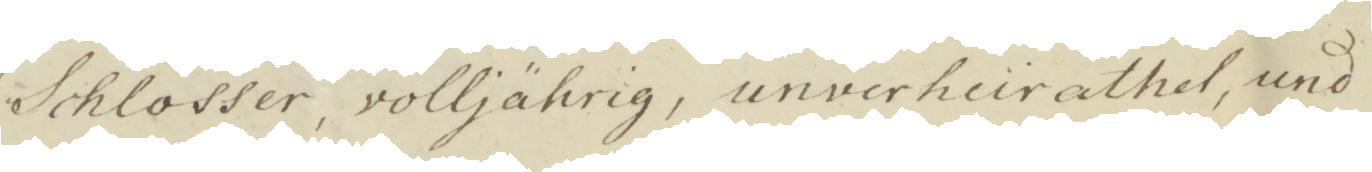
Schlosser, volljährig, unverheirathet, und
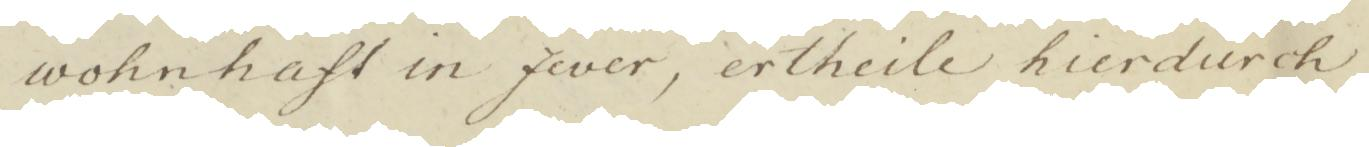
wohnhaft in Jever, ertheile hierdurch
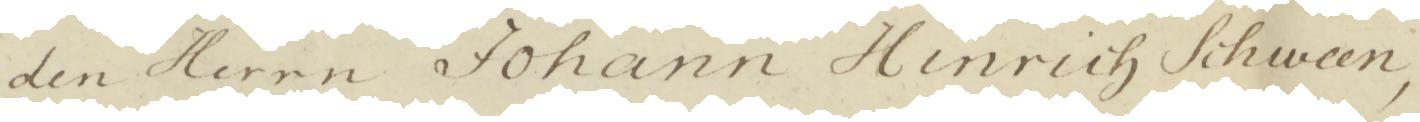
den Herrn Johann Hinrich Schween,
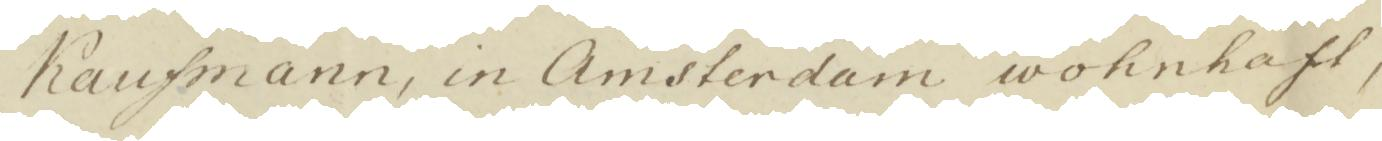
Kaufmann, in Amsterdam wohnhaft,
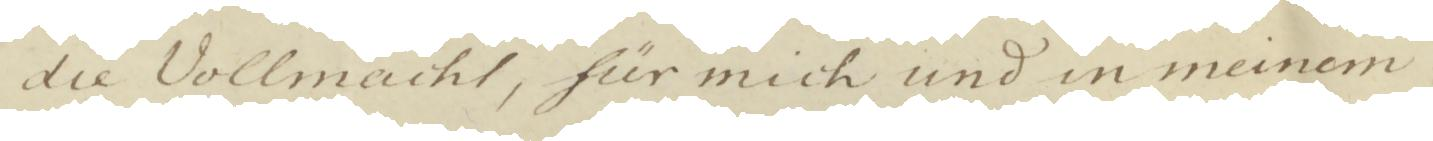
die Vollmacht, für mich und in meinem
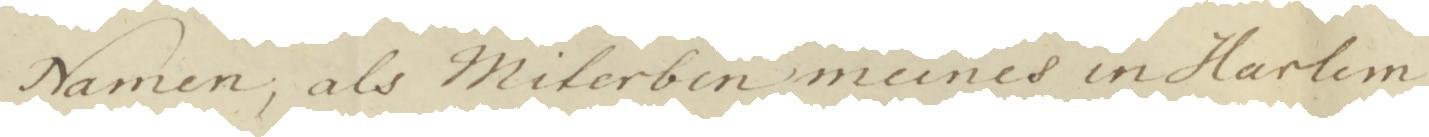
Namen; als Miterbin meines in Harlem
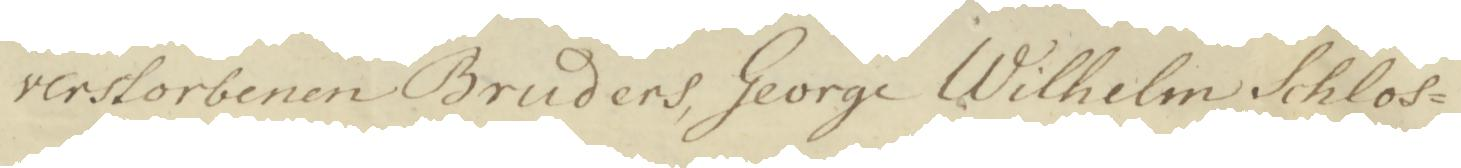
verstorbenen Bruders, George Wilhelm Schlos=
